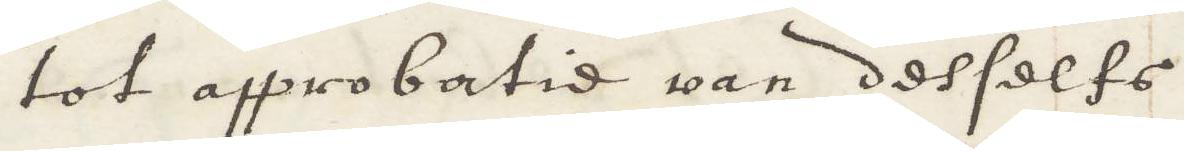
tot approbatie van desselfs
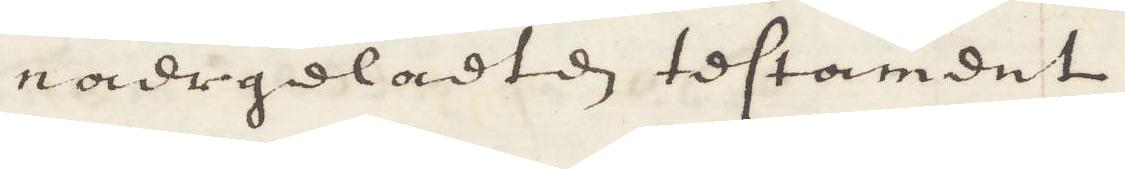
naergelaeten testament
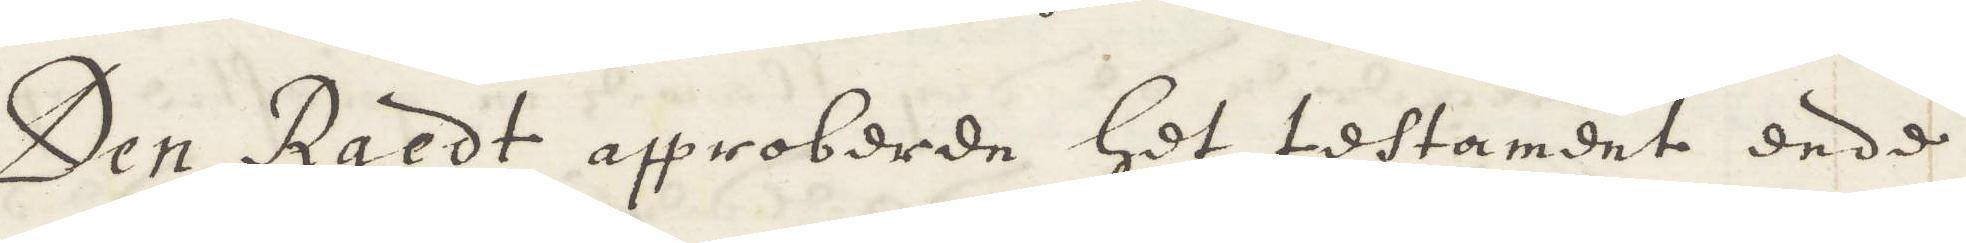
Den Raedt approberen het testament ende
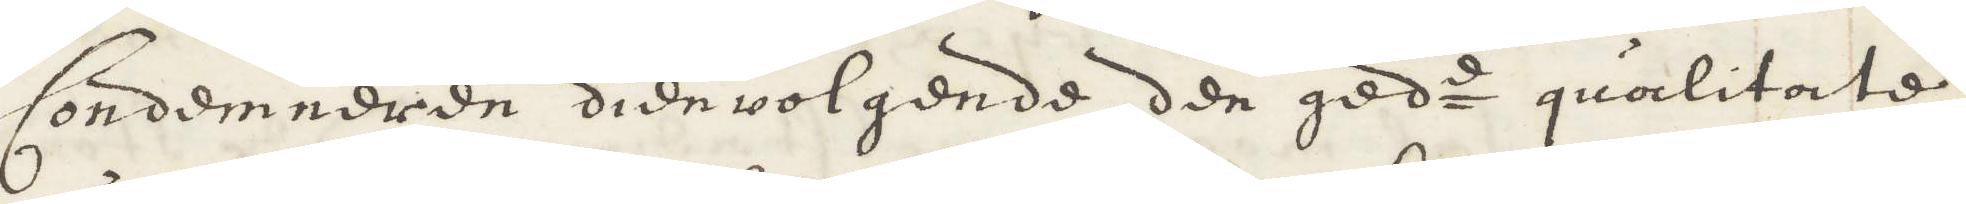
Condemneren dien volgende den ged=e qualitate
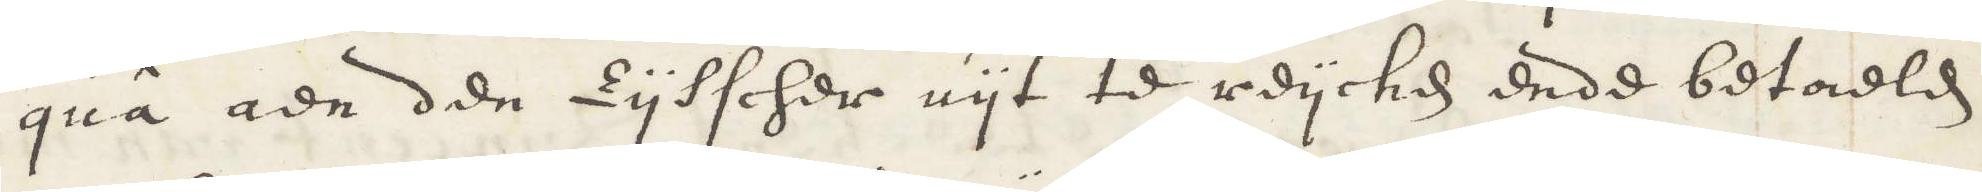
quâ aen den Eijsscher uijt te reijcken ende betaelen
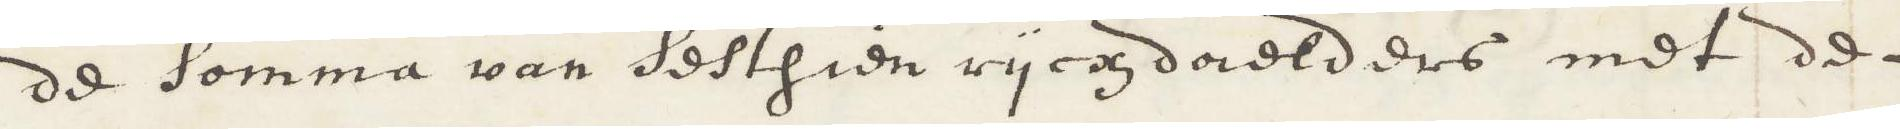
de somma van sesthien rijcxdaelders met de
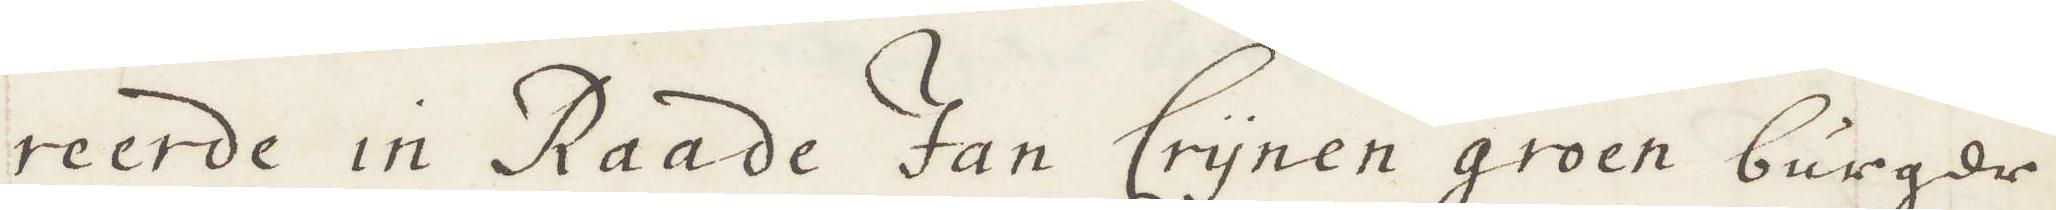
Compareerde in Raade Tan Crijnen groen burger
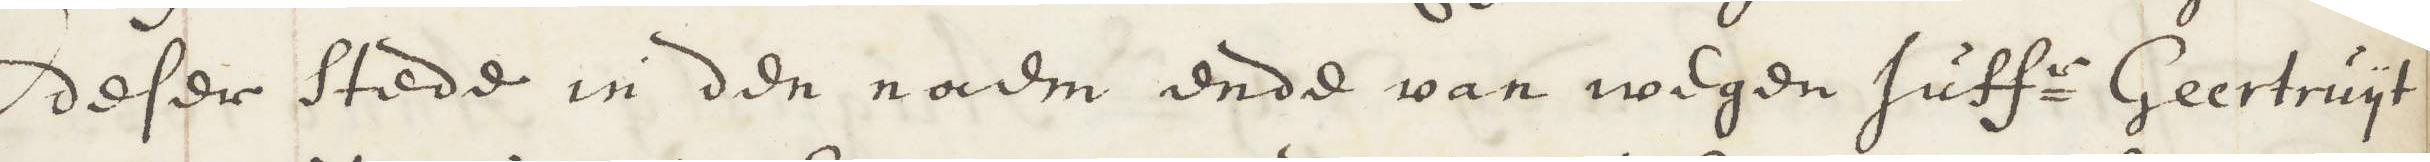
deser stede in den naem ende van wegen juff=r Geertruijt
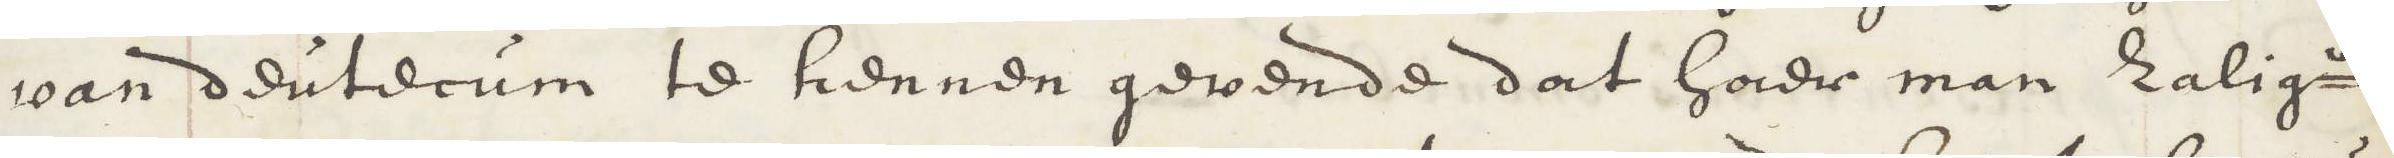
van deutecum te kennen gevende dat haer man zalig=r
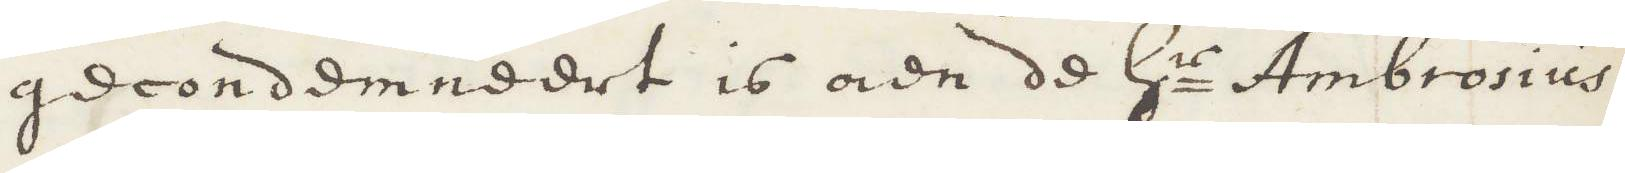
gecondemneert is aen de h=r Ambrosius
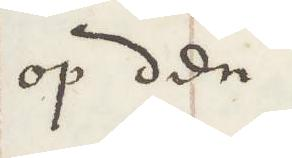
op den
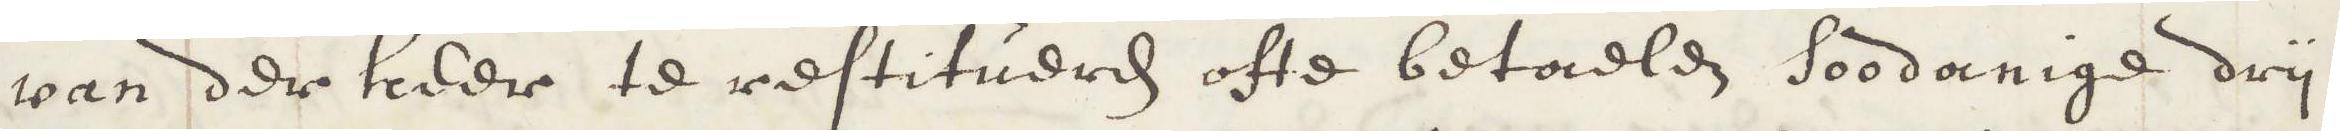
van der keer te restitueren ofte betaelen soodanige drij
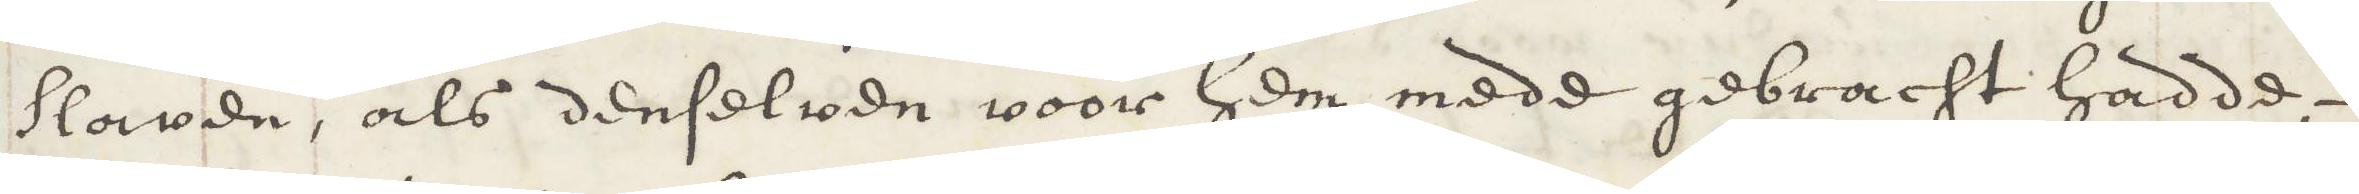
slaven, als denselven voor hem mede gebracht hadde,-
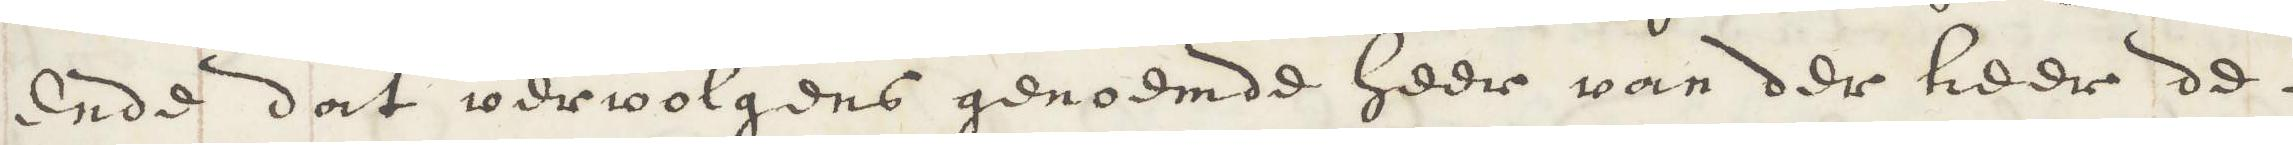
Ende dat vervolgens genoemde heer van der keer de
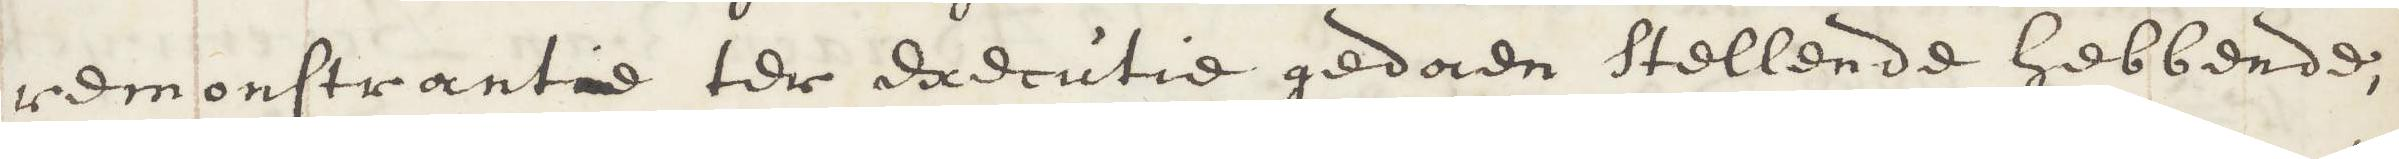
remonstrantie ter executie gedaen stellende hebbende,
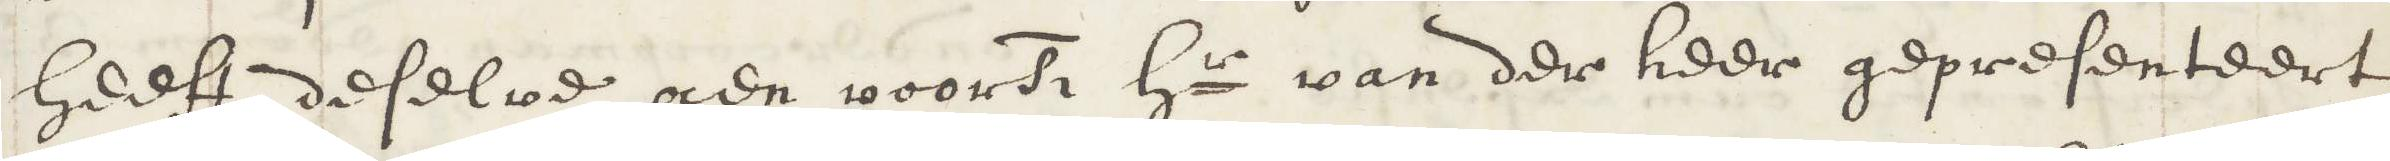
heeft deselve aen voorsi h=r van der keer gepresenteert
